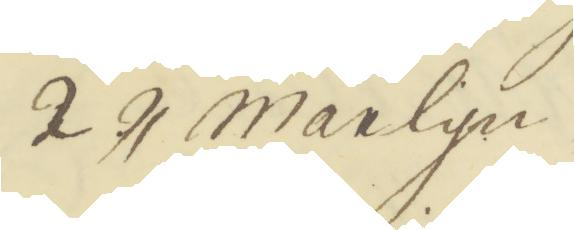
2 „ marlijn
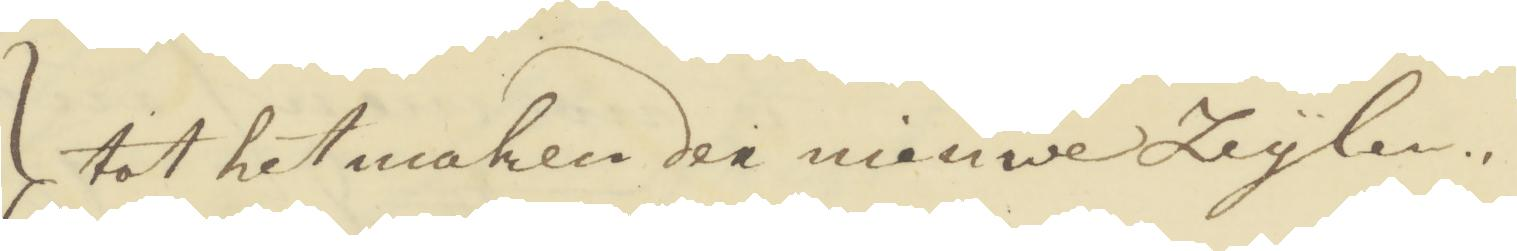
tot het maken der nieuwe zeijlen.,
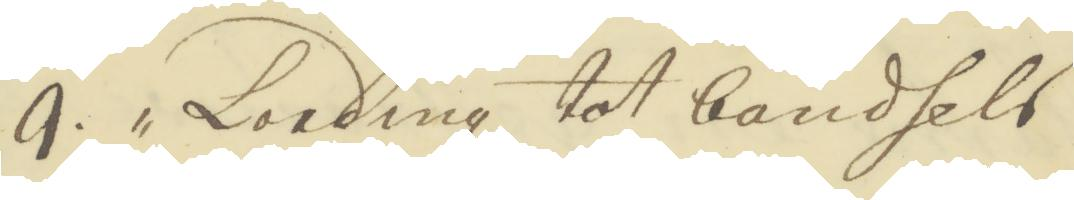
4. „ Lording tot bandsels
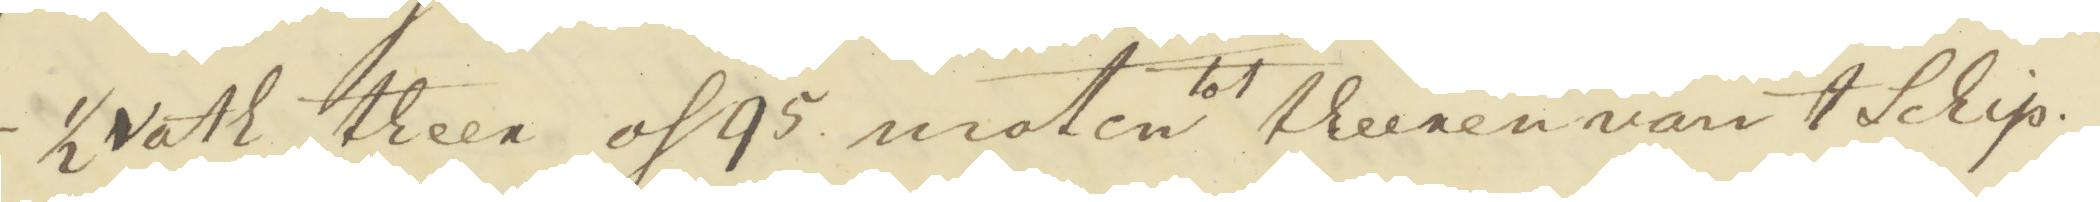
½ vath theer of 95. moten theeren van ’t schip.
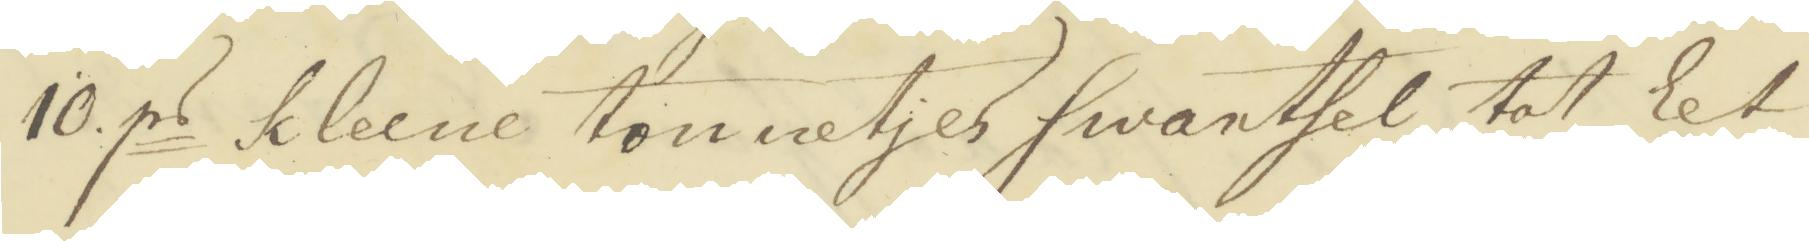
10. p=s kleene tonnetjes swartsel tot het
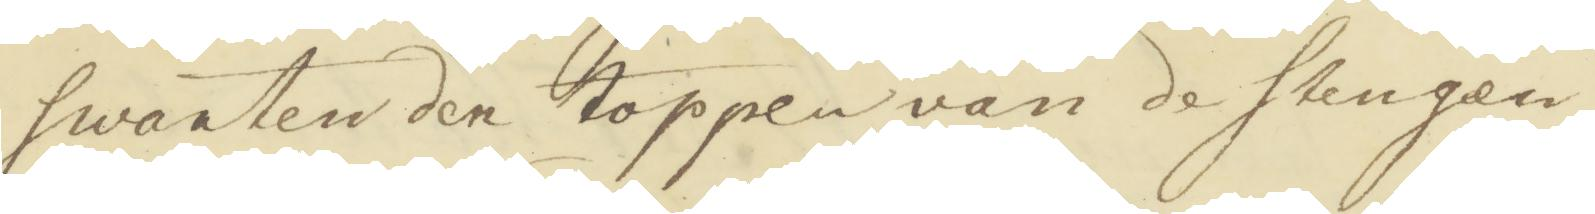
swarten der toppen van de stengen
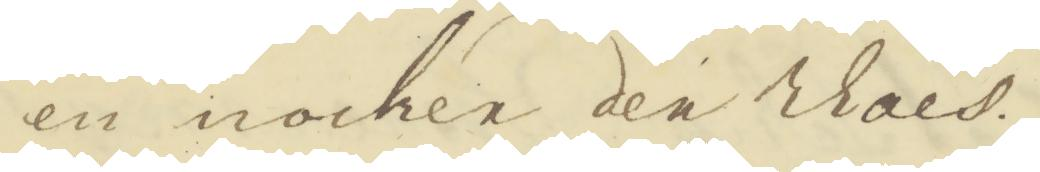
en nocker der rhaes.
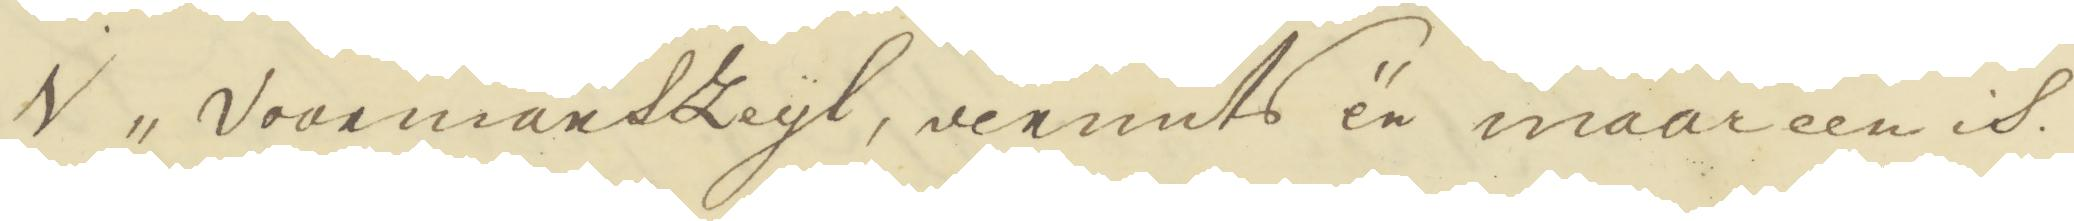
1 „ voormanszeijl, vermits "er maar een is.
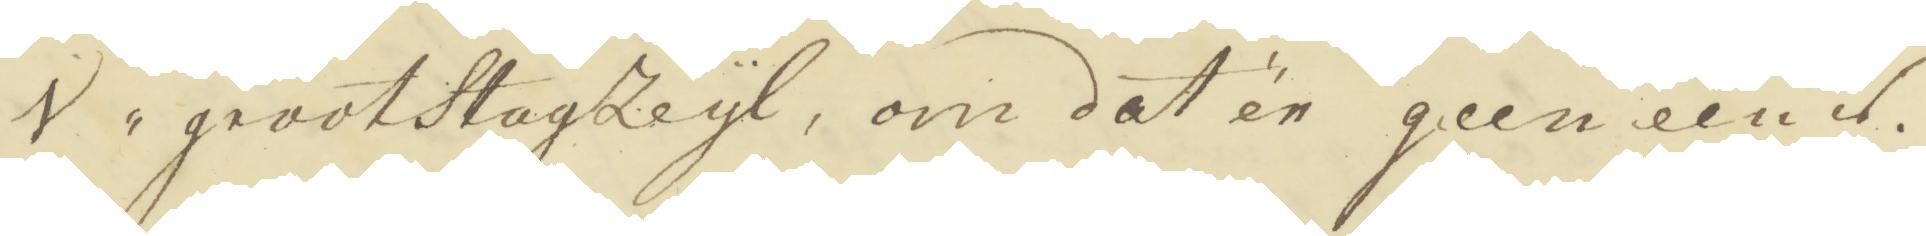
1 „ grootstagzeijl, om dat "er geen een is.
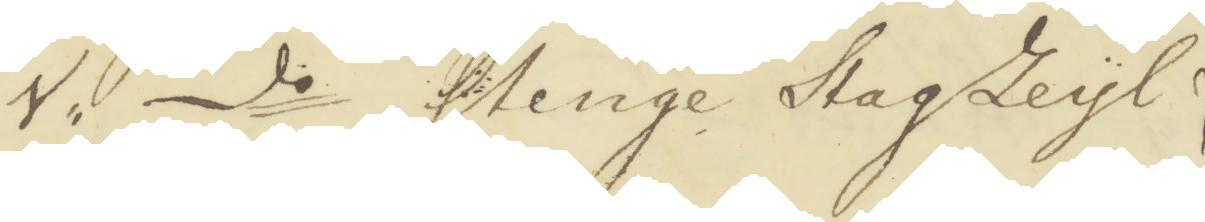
1 „ _=o stenge stag zeijl
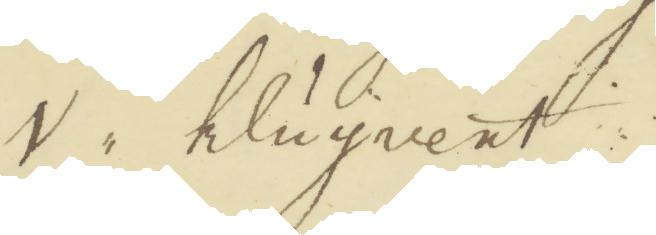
1 „ kluijvert .
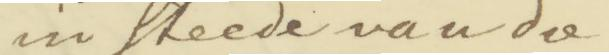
in steede van die
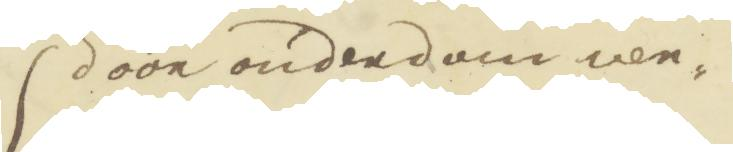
door ouderdom ver„
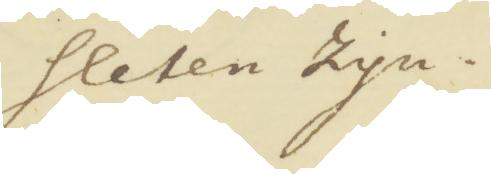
sleten zijn.
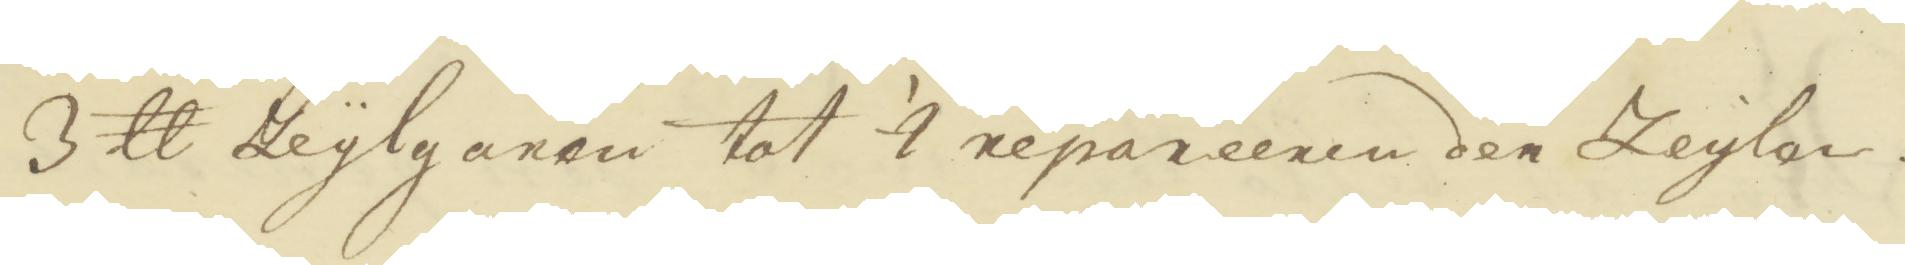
3 lb zeijlgaren tot ’t repareeren der zeijlen
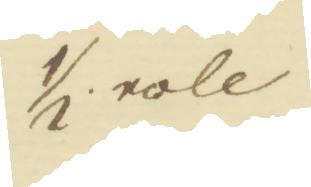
½. roll
